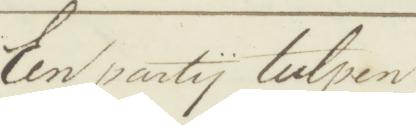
Een partij tulpen
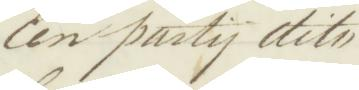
een partij dito
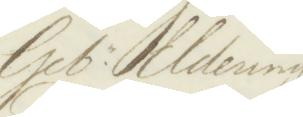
Geb: Eldering
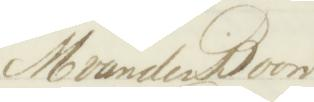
M vanderBoon
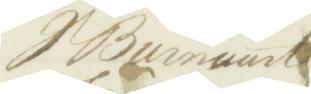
V Barnaart
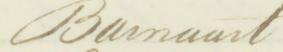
Barnaart
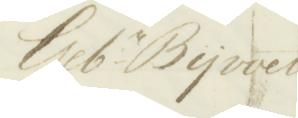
Geb:r Bijvoet
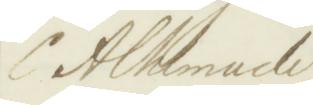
C Alkemade
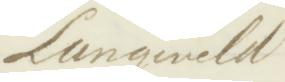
Langeveld
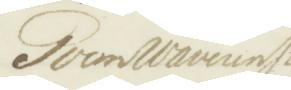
P van Waveren Jr
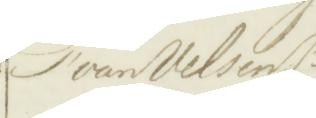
F vanVelsen J
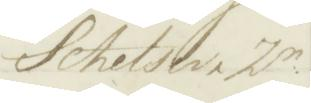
Schetser & Zn
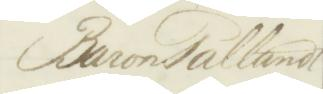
Baron Pallandt
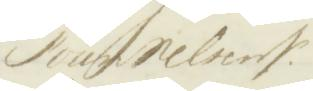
F van Velsen J.r
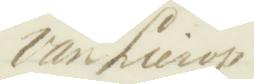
van Lierop
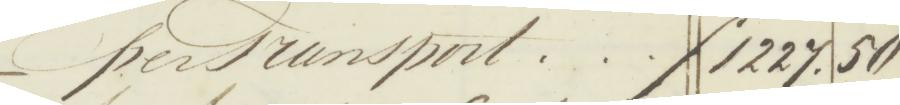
Per Transport . . . ƒ 1227.50
